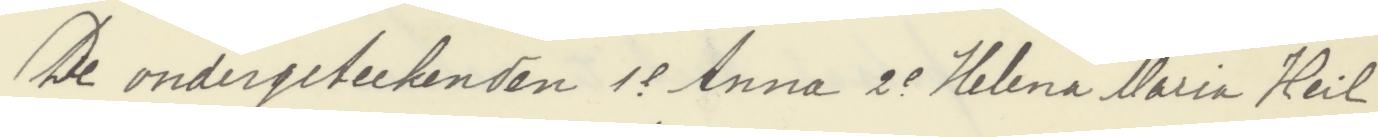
De ondergeteekenden 1:e Anna 2:e Helena Maria Heil
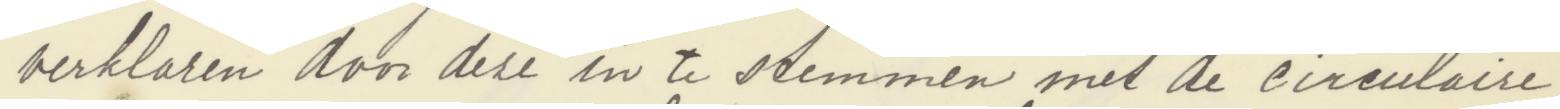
verklaren door deze in te stemmen met de circulaire
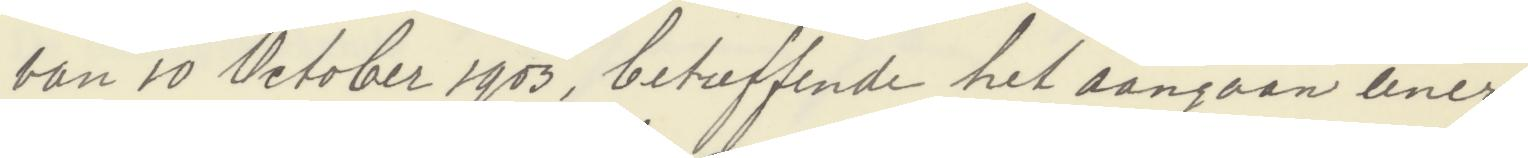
van 10 October 1903, beteffende het aangaan eener
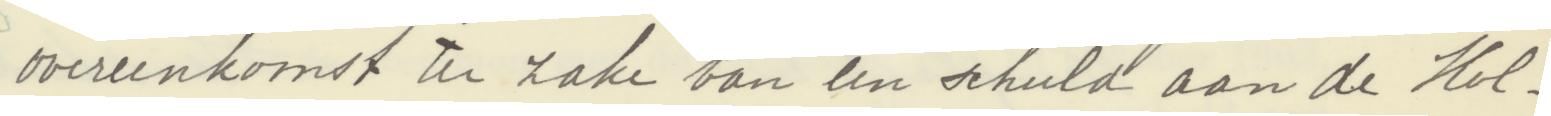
overeenkomst ter zake van een schuld aan de Hol-
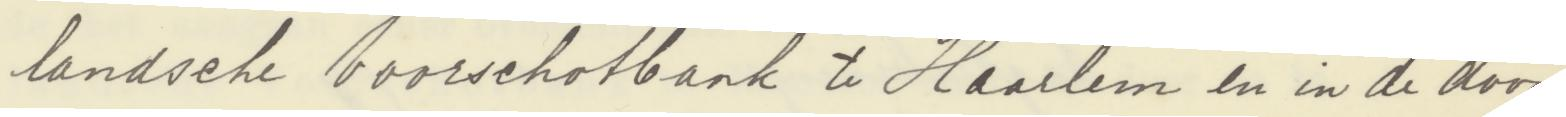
landsche Voorschotbank te Haarlem en in de door
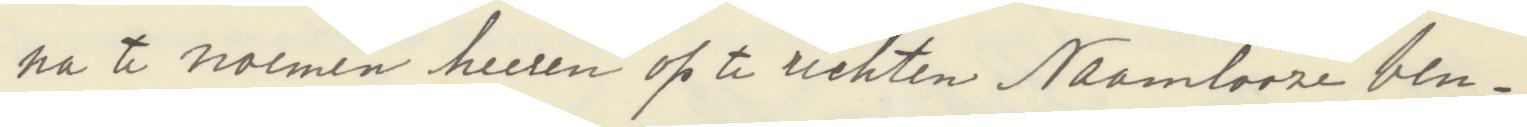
na te noemen heeren op te richten Naamlooze Ven-
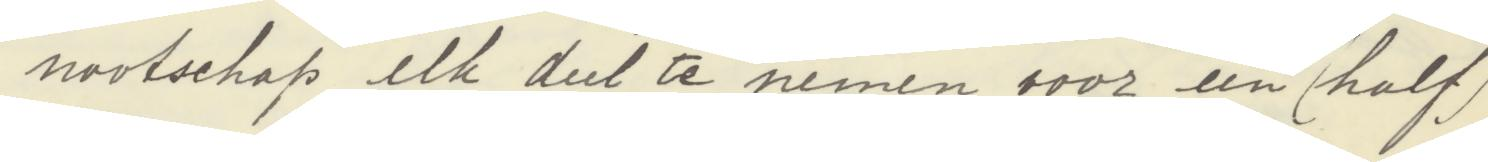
nootschap elk deel te nemen voor een (half)
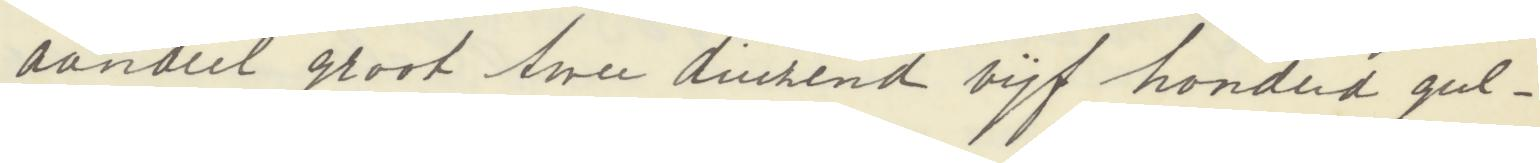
aandeel groot twee duizend vijf honderd gul-
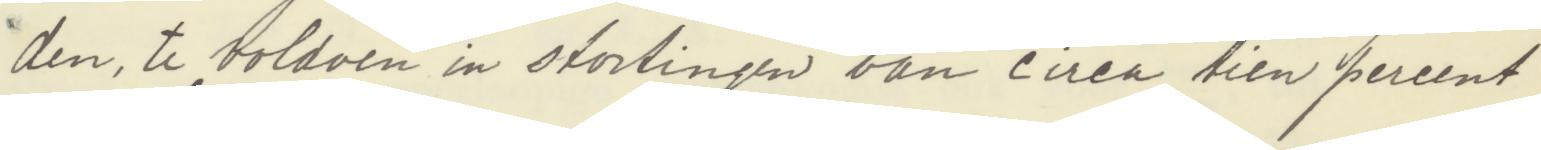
den, te voldoen in stortingen van circa tien percent
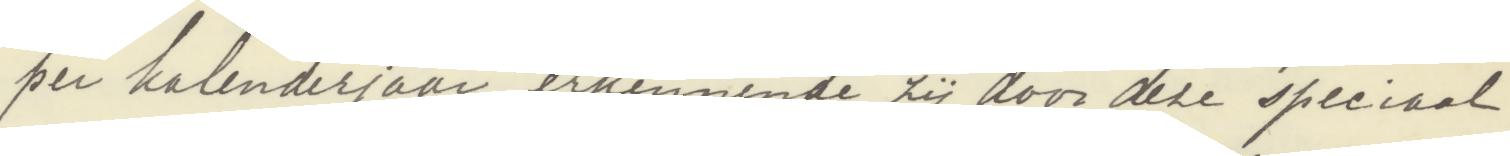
per kalenderjaar, erkennende zij door deze speciaal
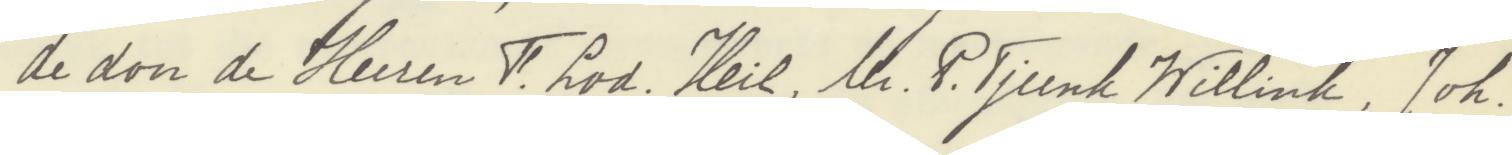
de door de Heeren F. Lod. Heil, Mr. P. Tjeenk Willink, Joh.
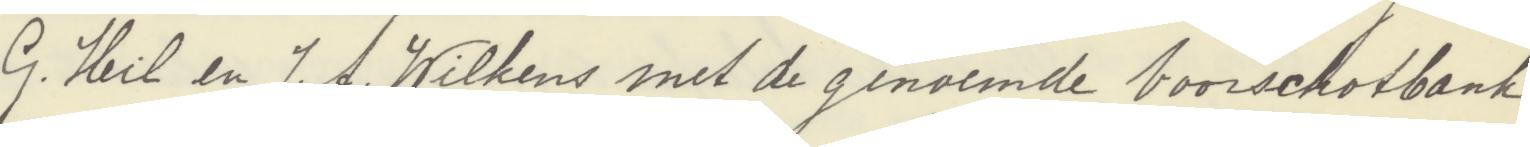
G. Heil en J. A. Wilkens met de genoemde Voorschotbank
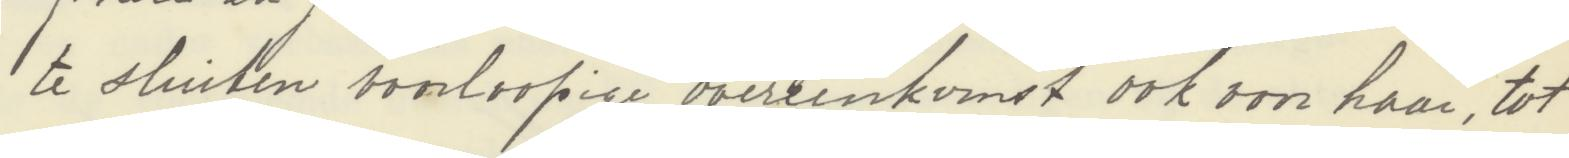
te sluiten voorloopige overeenkomst ook voor haar, tot
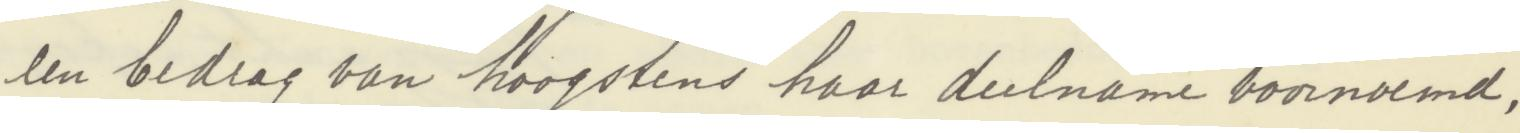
een bedrag van hoogstens haar deelname voornoemd,
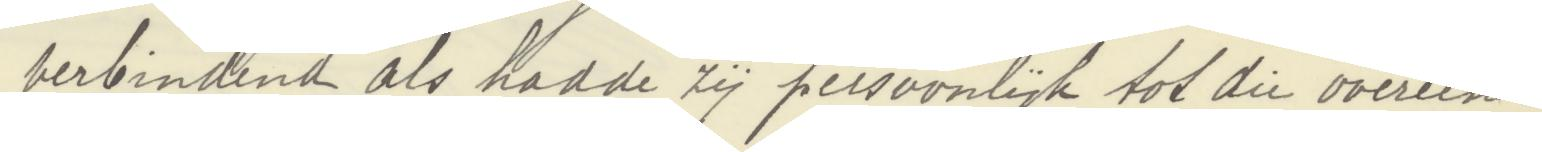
verbindend als hadde zij persoonlijk tot die overeen-
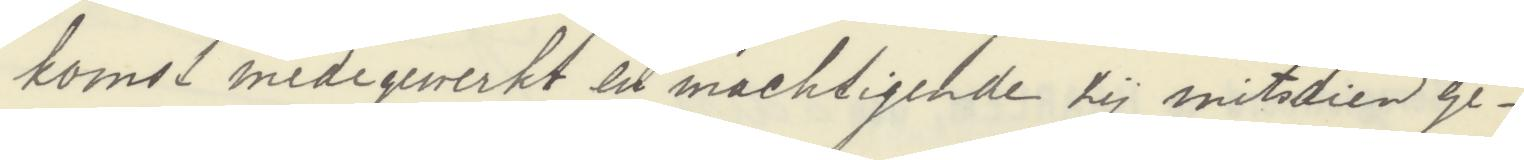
komst medegewerkt en machtigende zij mitsdien ge-
